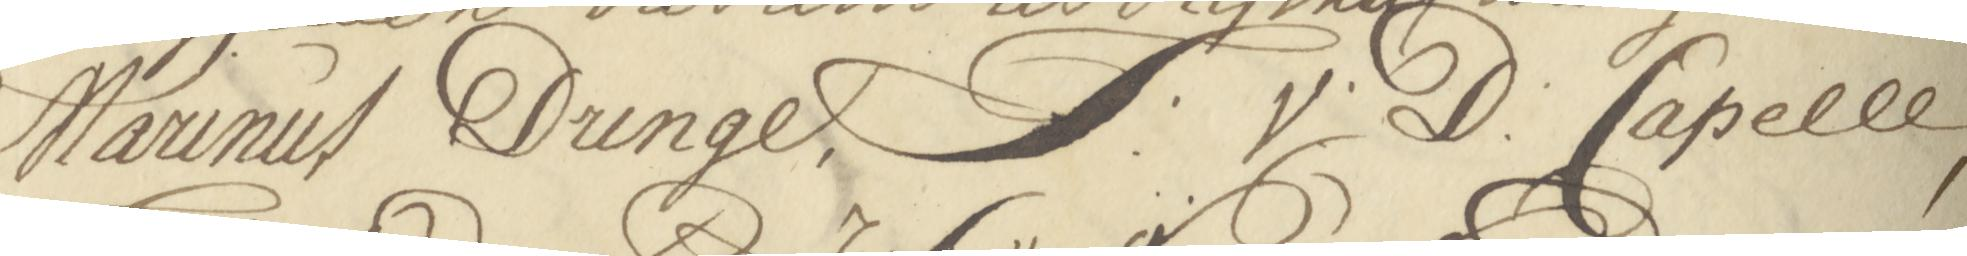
Marinus Dringe, I: v: D: Capelle
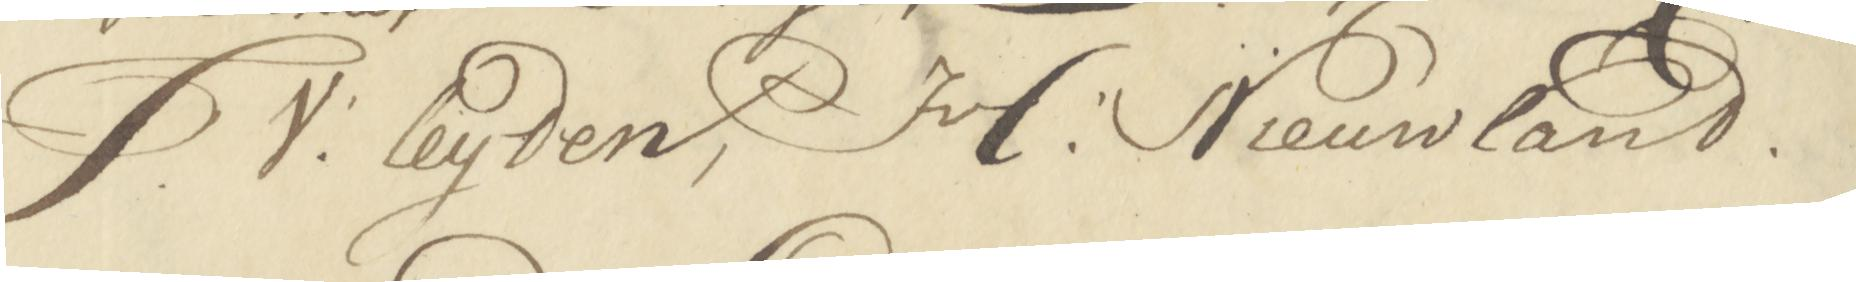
J: v: leyden, H: Nieuwland.
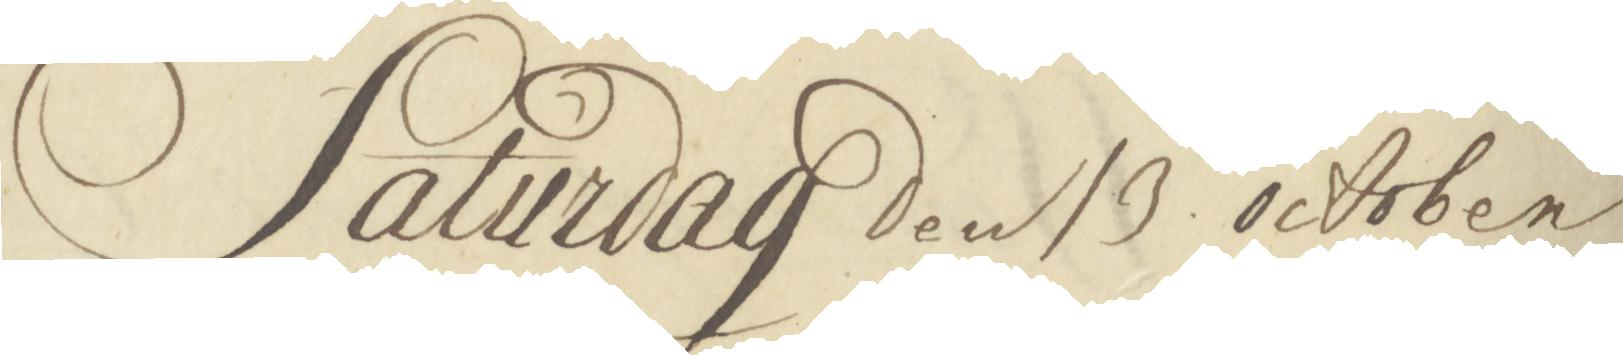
Saturdag den 13:' october
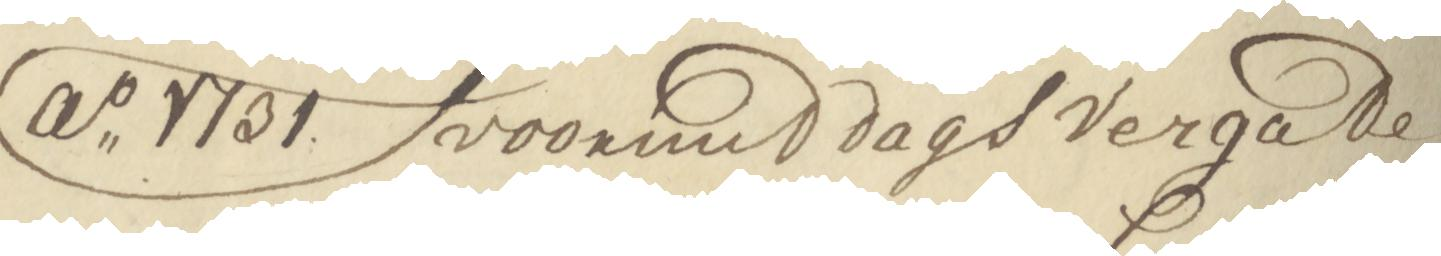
a„o 1731. voormiddags vergade
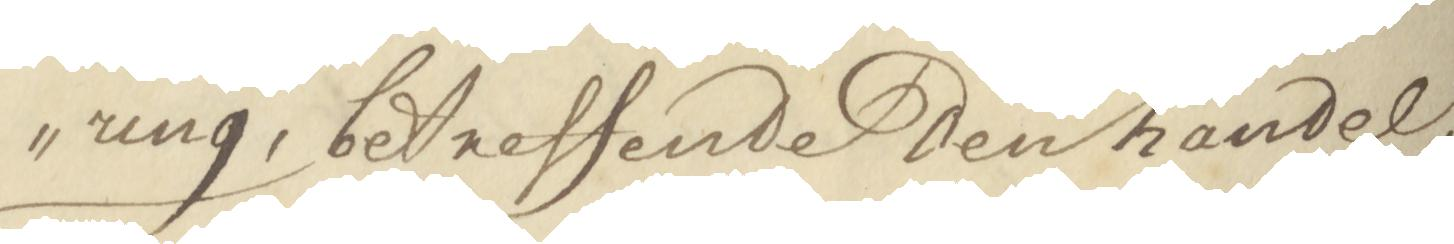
„ring, betreffende den handel
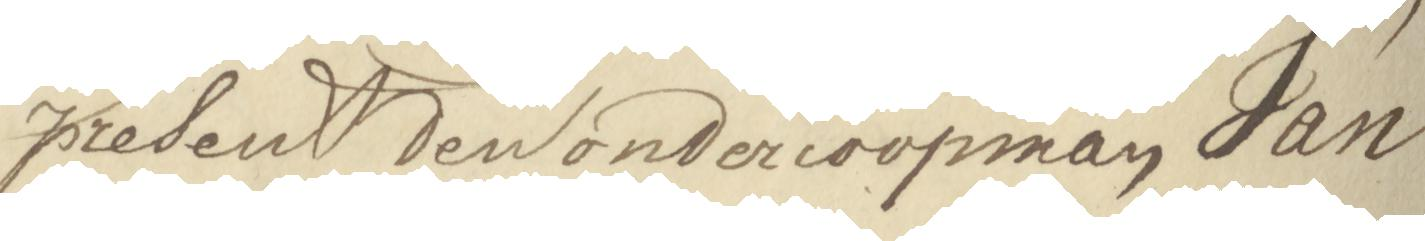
present den ondercoopman Ian
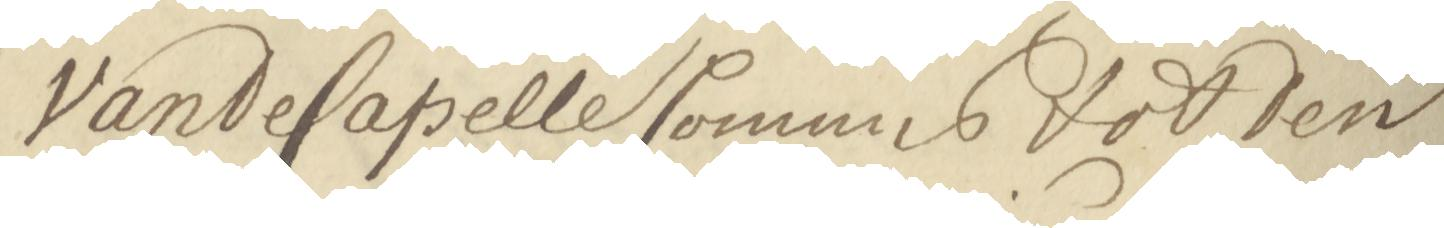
van de Capelle Commis tot den
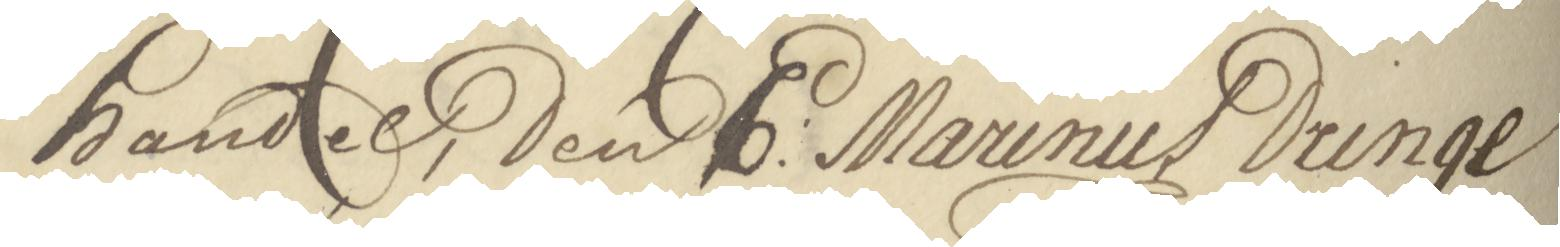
handel, den E: Marinus dringe
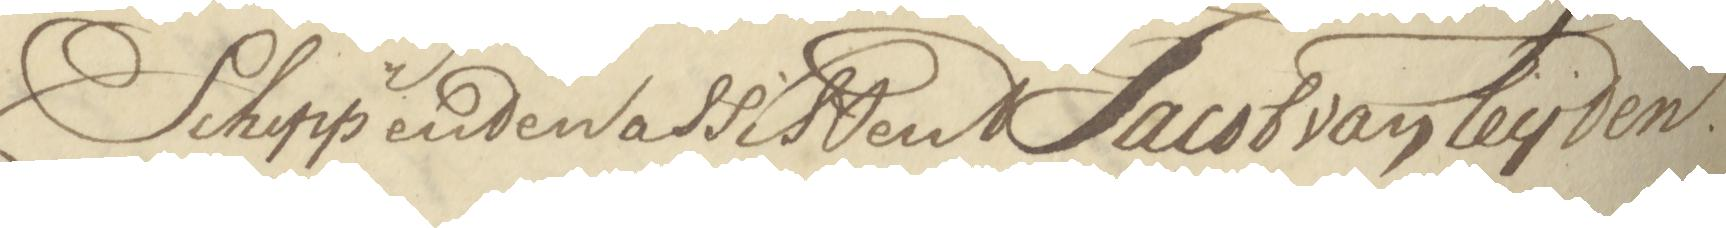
schippr en den assistent Iacob van leijden
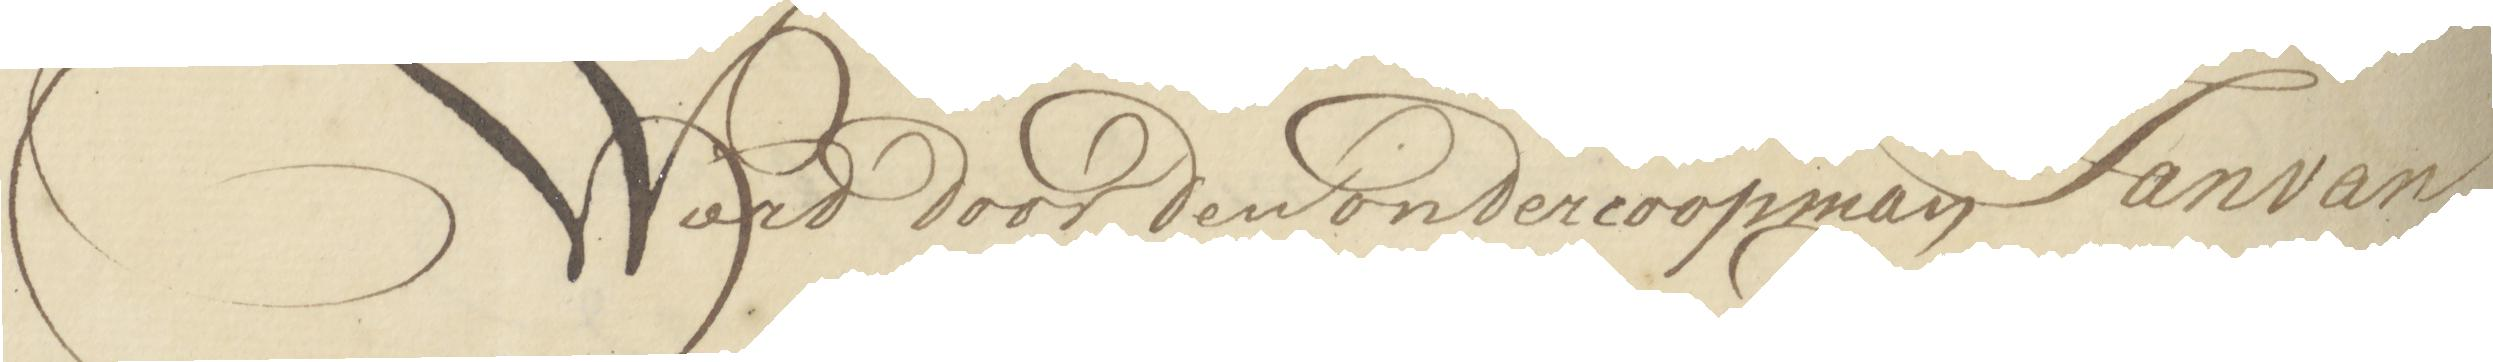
Wierd door den ondercoopman Ian van
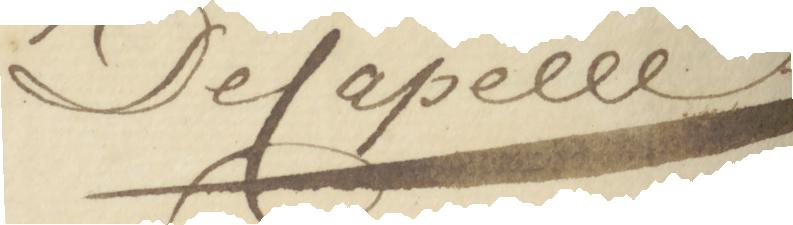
De Capelle
